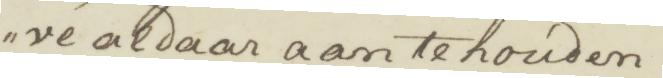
„ve aldaar aan te houden
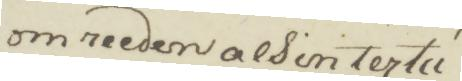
om reeden als in textu
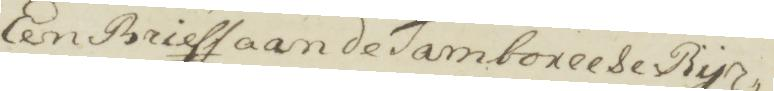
Een Brieff aan de Tamboreese Rijx„
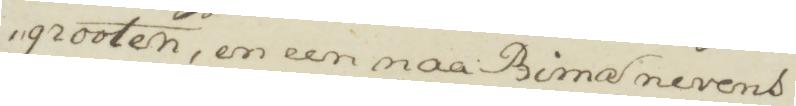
„grooten, en een naa Bima nevens
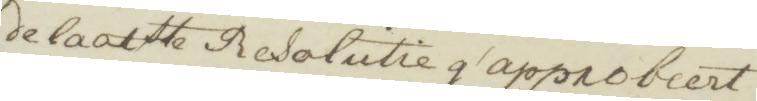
de laatste Resolutie g’approbeert
